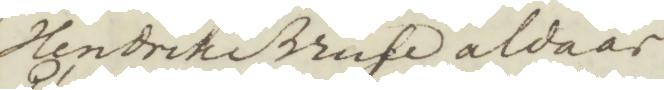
Hendrik Bruse aldaar
